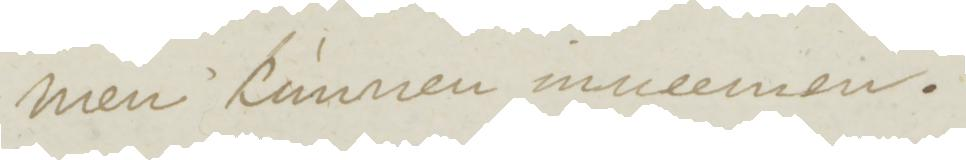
men kunnen inneemen.
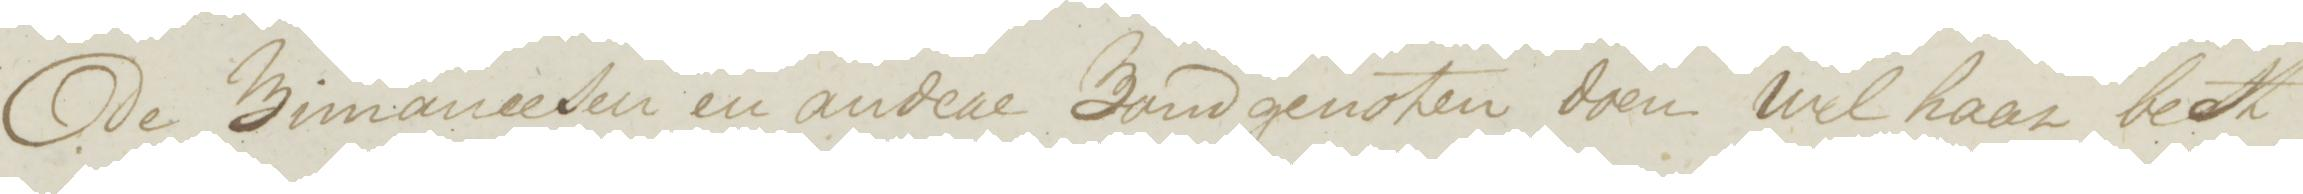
de Bimaneesen en andere Bondgenoten doen wel haar best
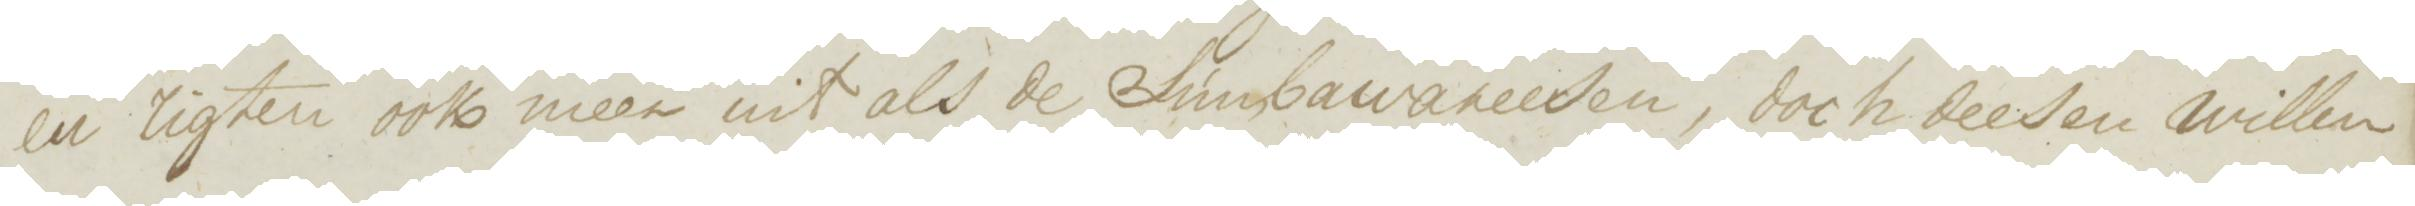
en rigten ook meer uit als de sumbawareesen, doch deesen willen
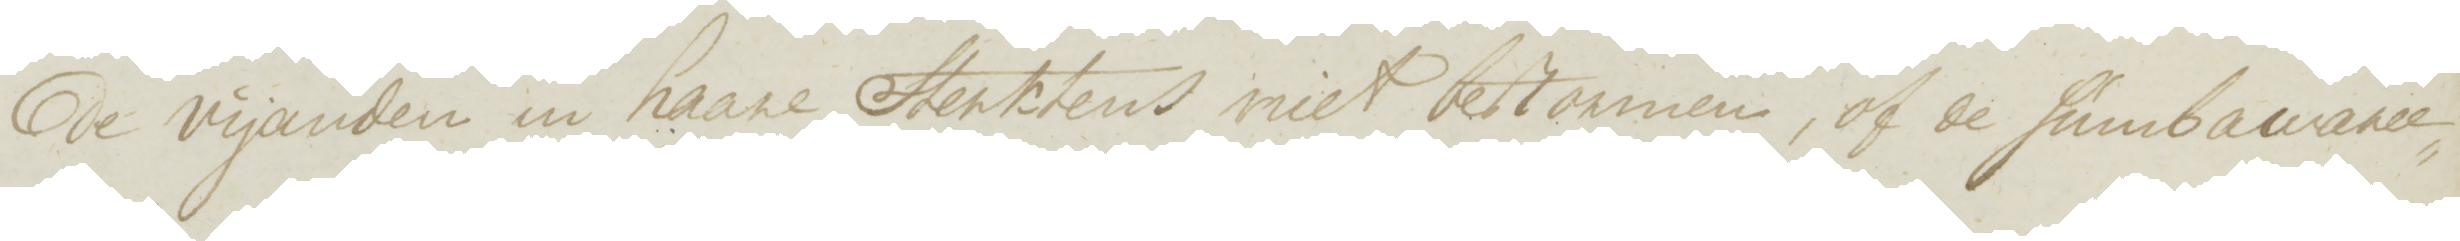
de vijanden in haare sterktens niet bestormen, of de sumbawaree„
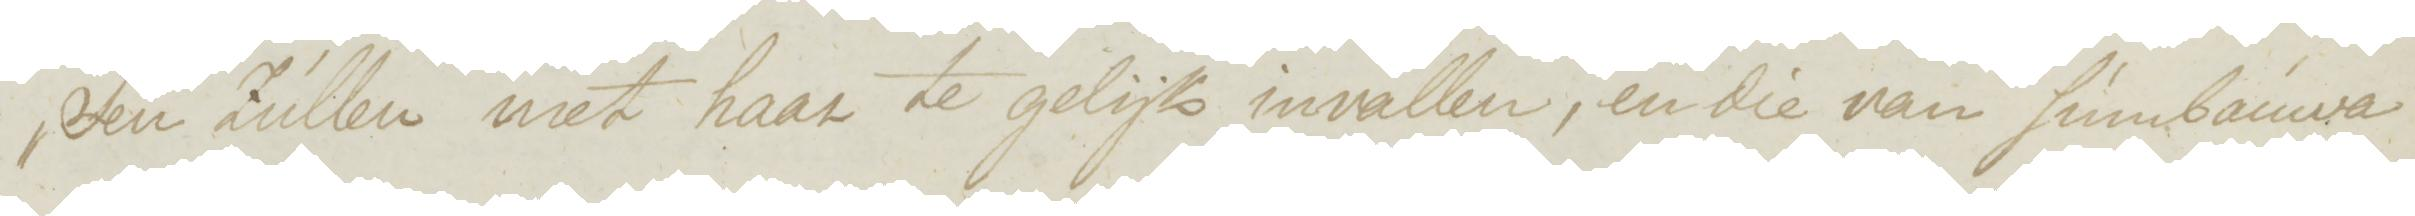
„sen zullen met haar te gelijk invallen, en die van sumbauwa
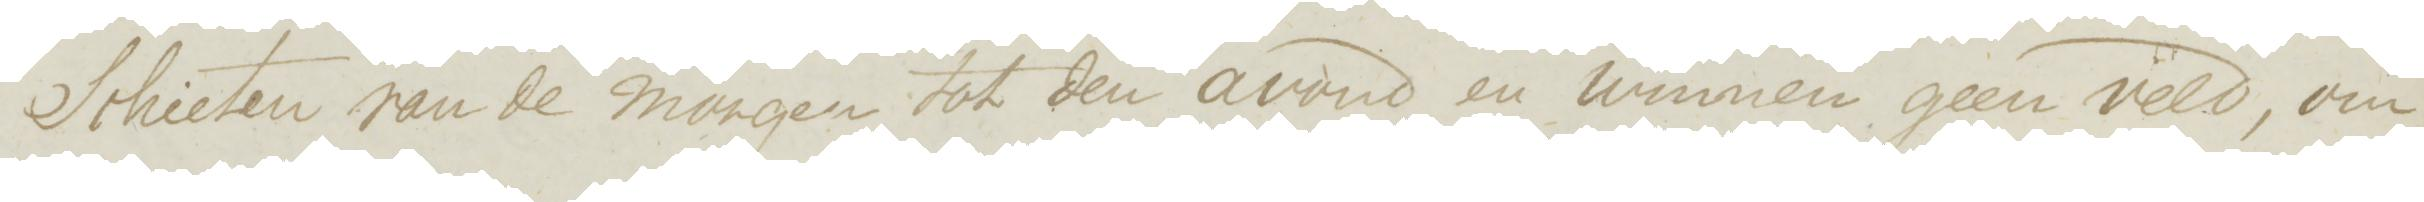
schieten van de morgen tot den avond en winnen geen veld, om
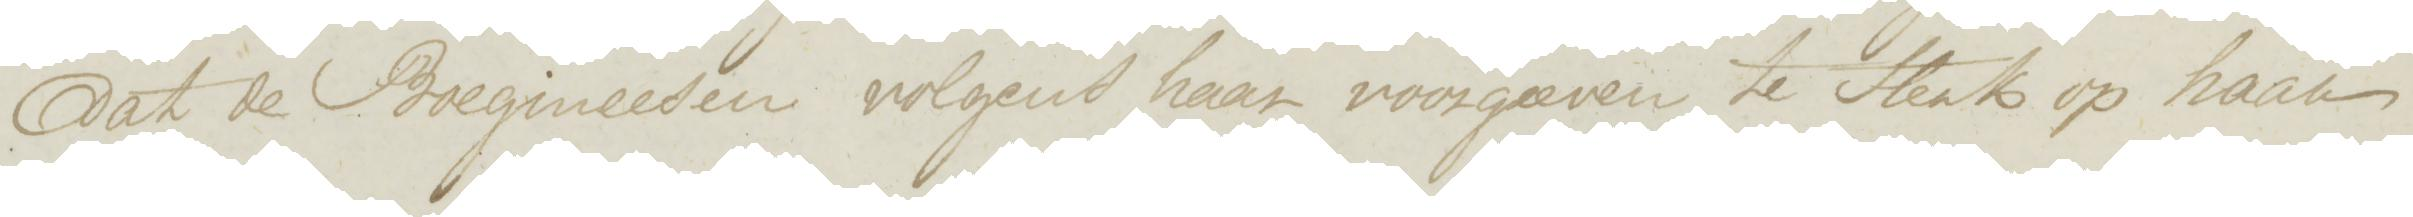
dat de Boegineesen volgens haar voorgeeven te sterk op haar
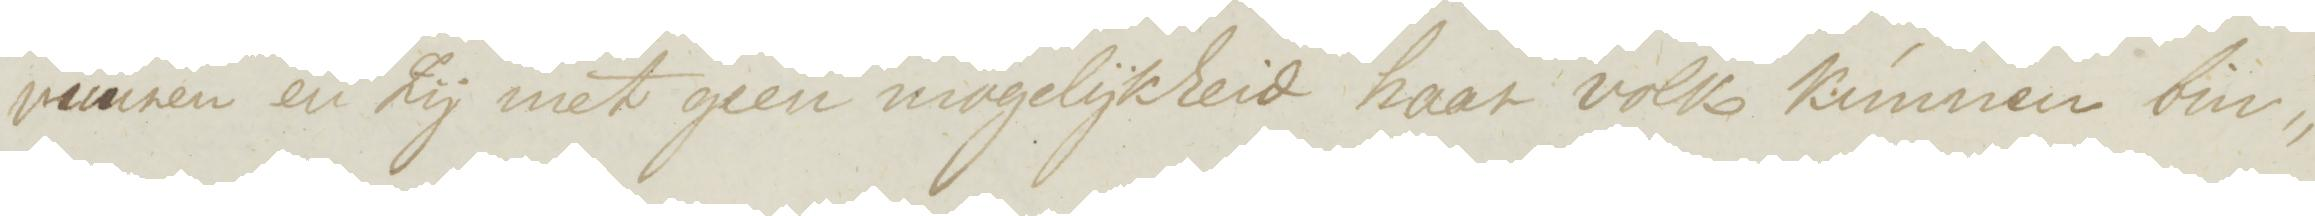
vuuren en zij met geen mogelijkheid haar volk kunnen bin„
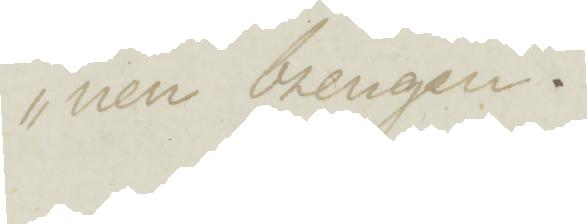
„nen brengen.
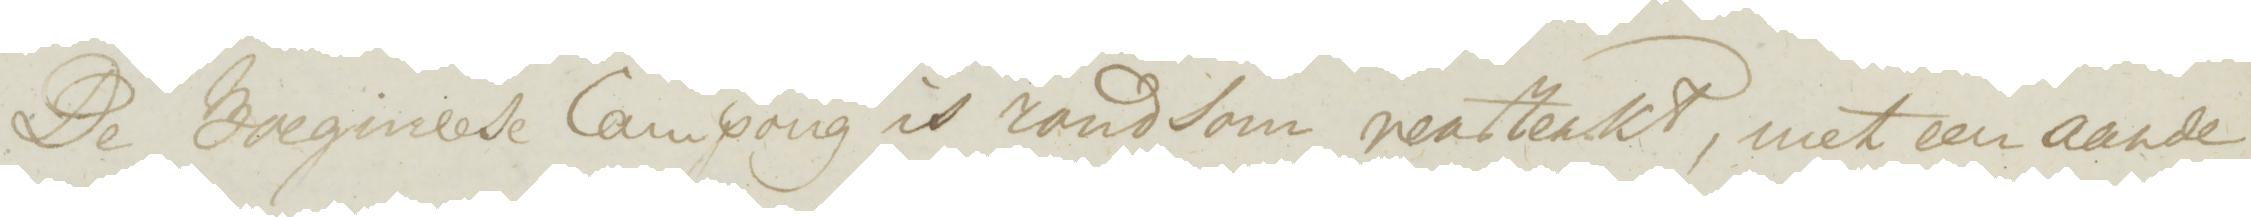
De Boegineese Campong is rondsom versterkt, met een aarde
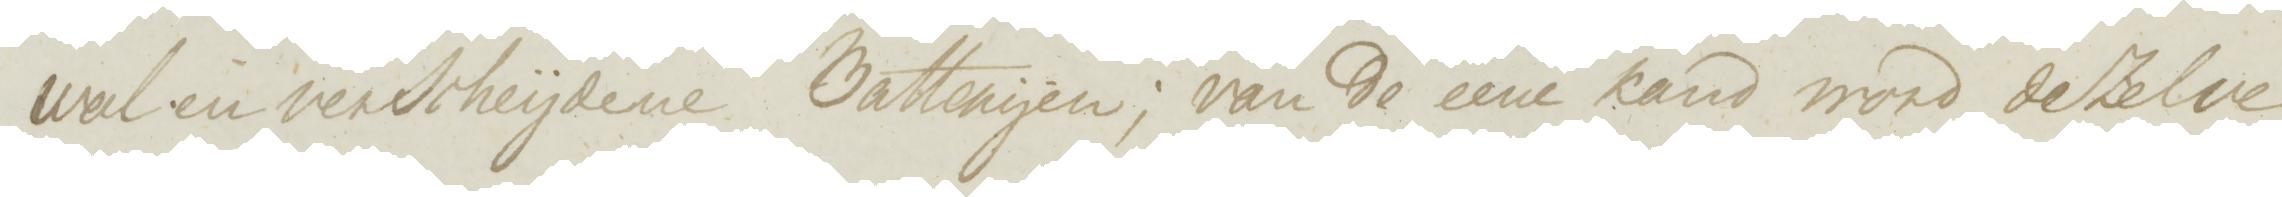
wal en verscheijdene Batterijen; van de eene kand word dezelve
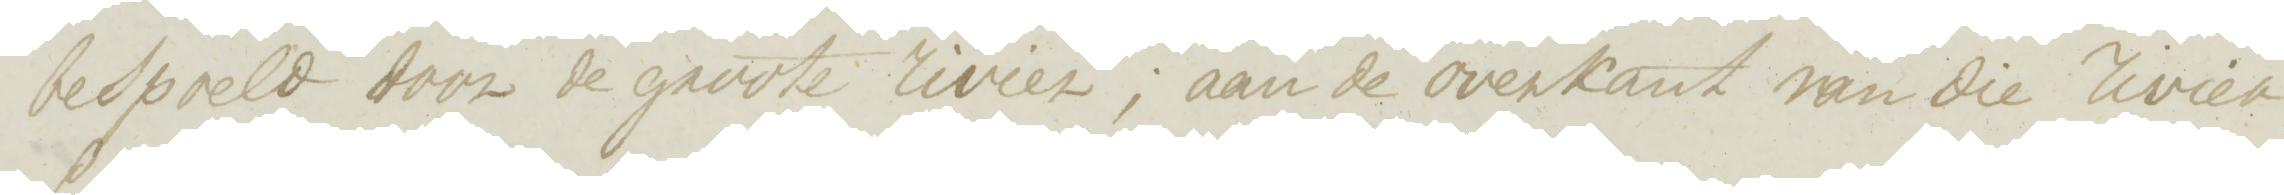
bespoeld door de groote rivier; aan de overkant van die rivier
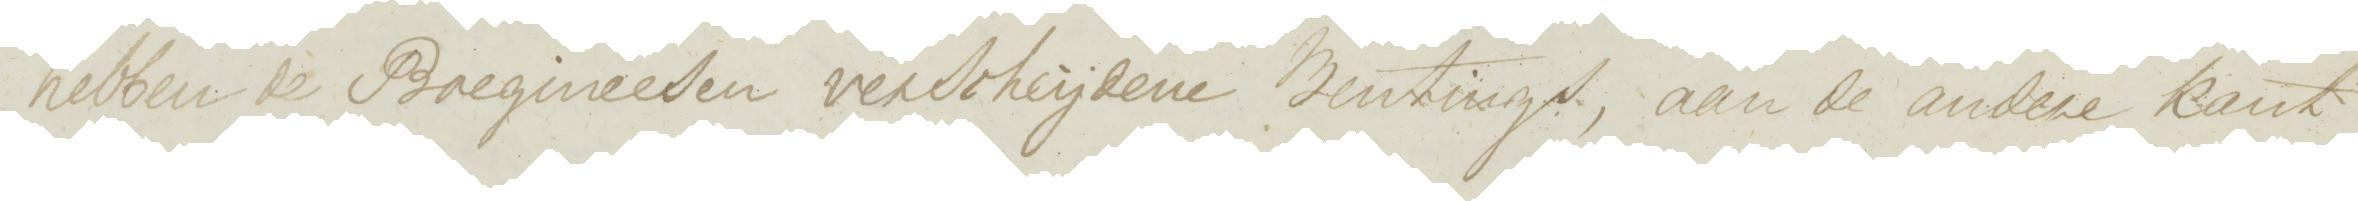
hebben de Boegineesen verscheijdene Bentings, aan de andere kant:
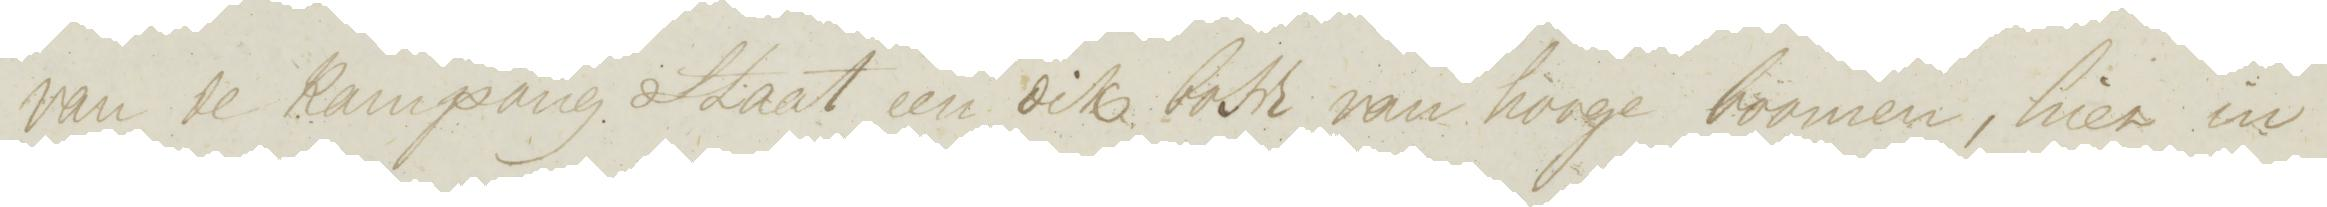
van de kampang staat een dik: bosch: van hooge koomen, hier in
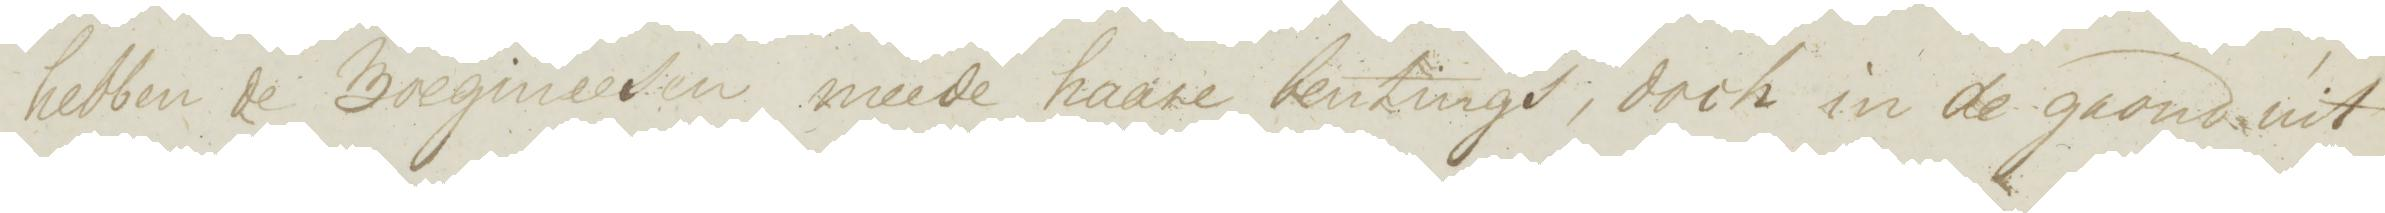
hebben de Boegineesen meede haare bentings, doch in de grond uit
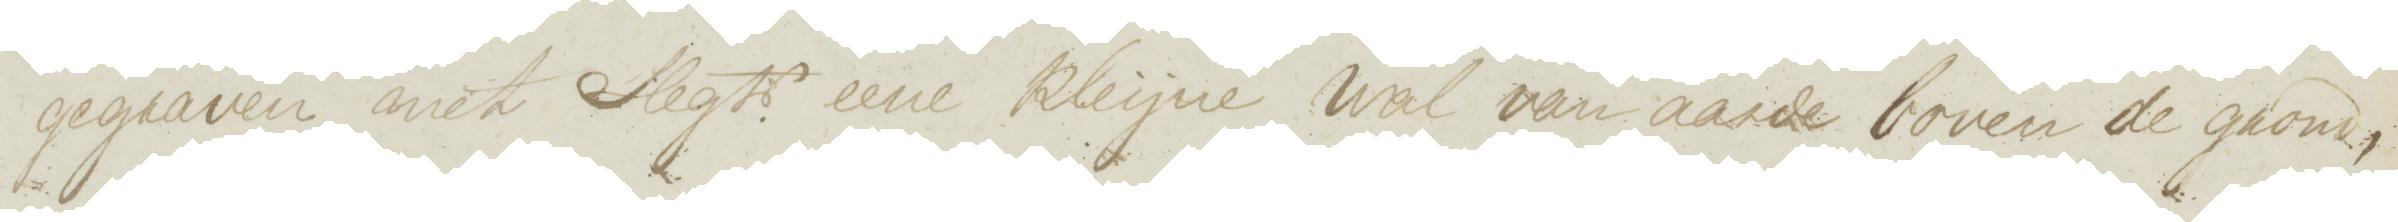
gegraven met slegts eene kleijne wal van aarde boven de grond,
